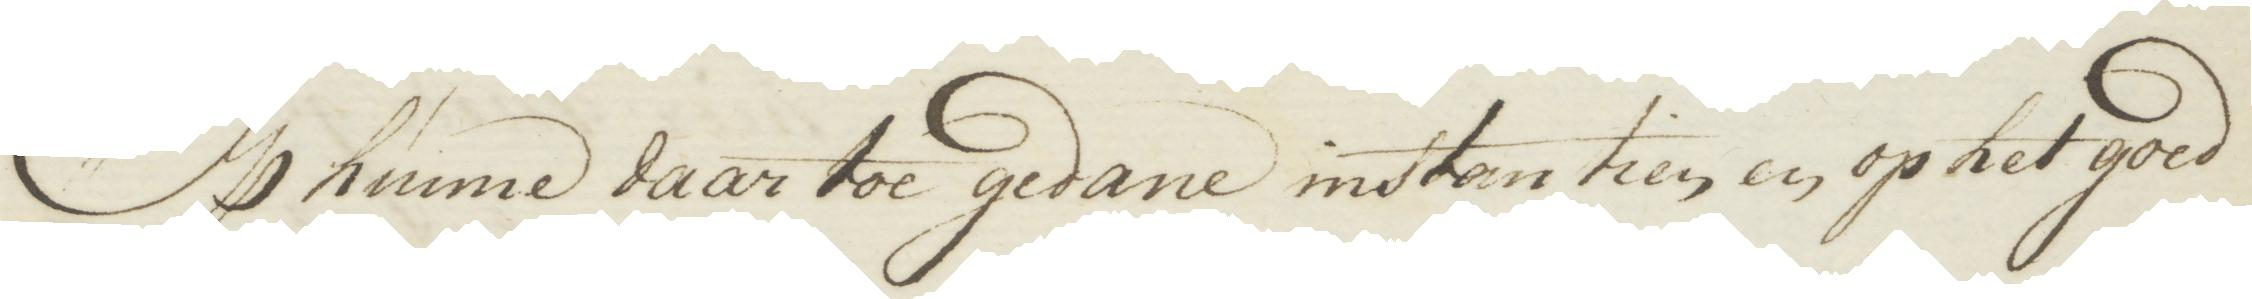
Op hunne daar toe gedane instantien en op het goed
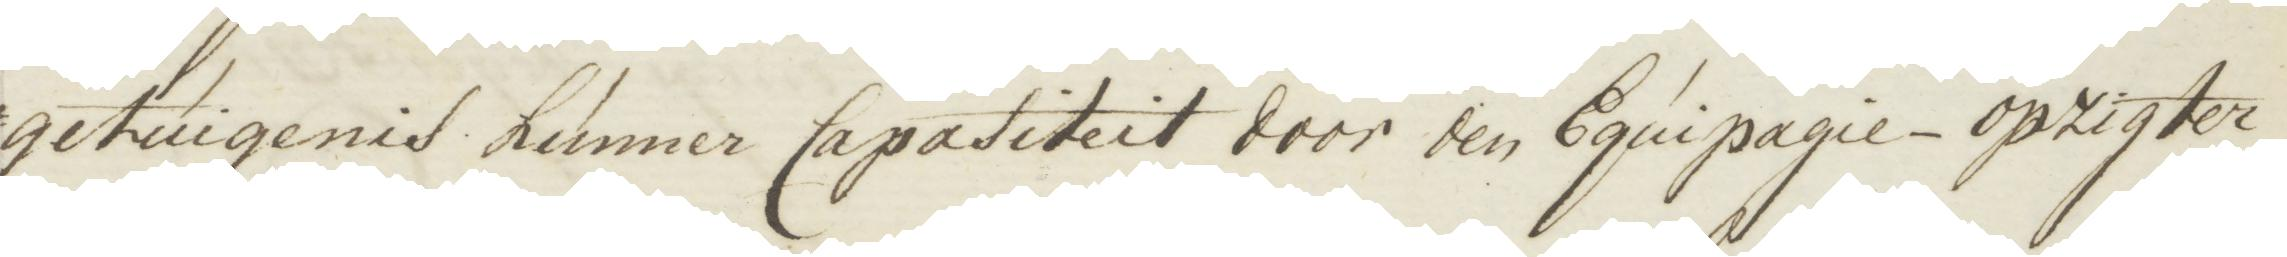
getuigenis hunner Capasiteit door den Equipagie-opzigter
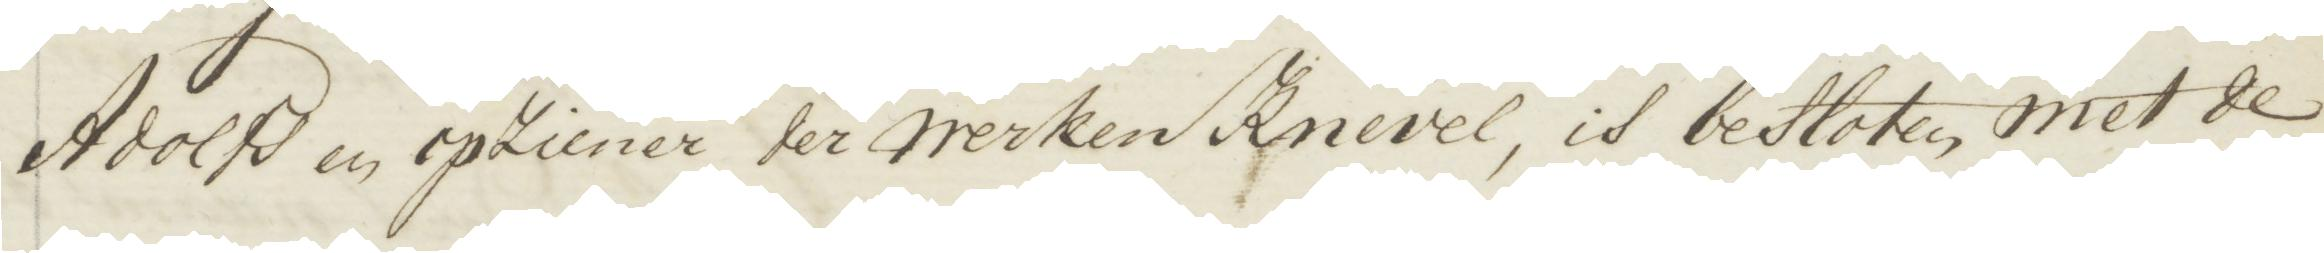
Adolfs en opziener der werken Knevel, is besloten met de
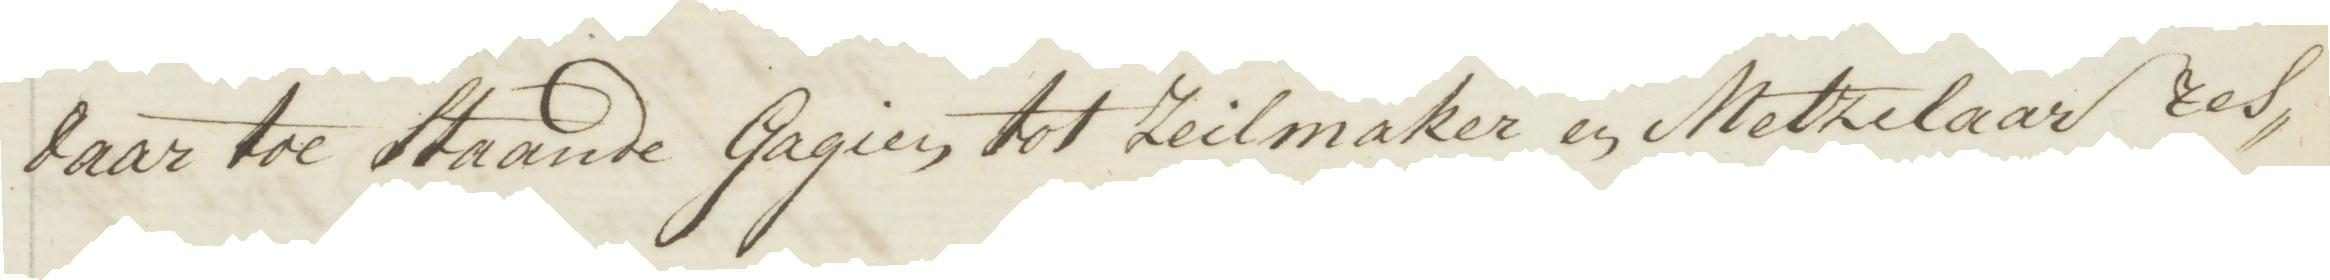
daar toe Staande Gagien tot Zeilmaker en Metzelaar res„
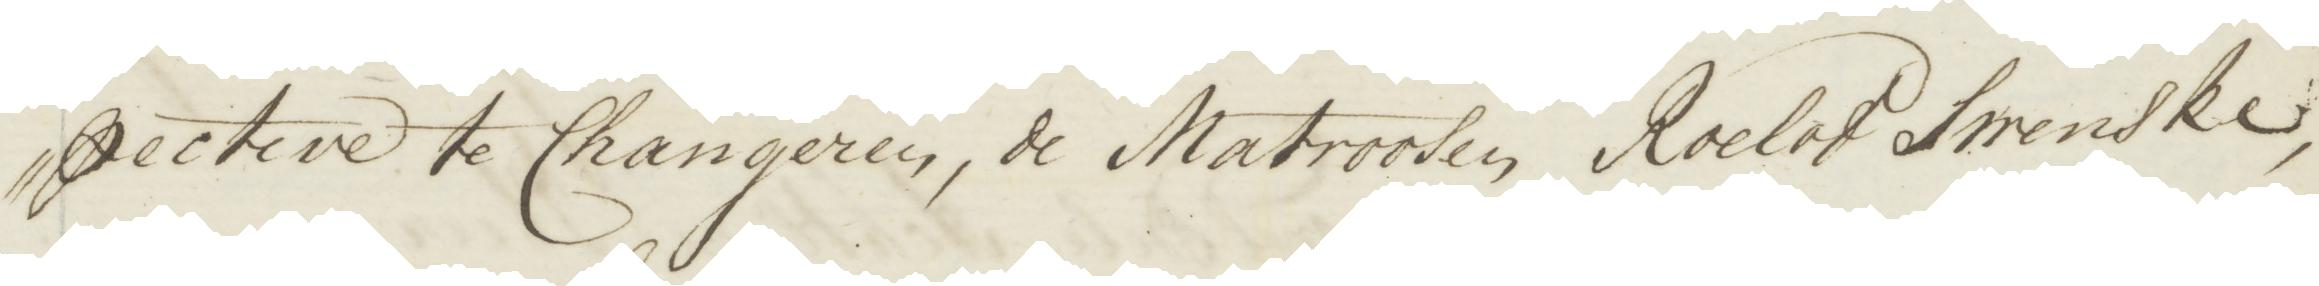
„pective te Changeren, de Matroosen Roelof Swenske,
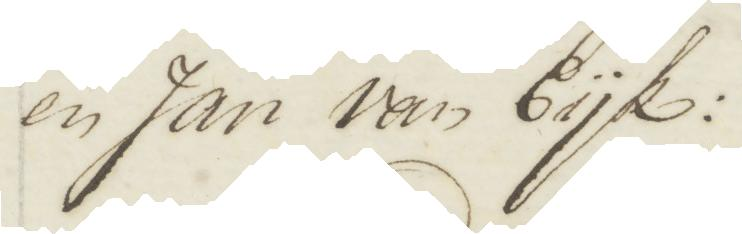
en Jan van Eijk:
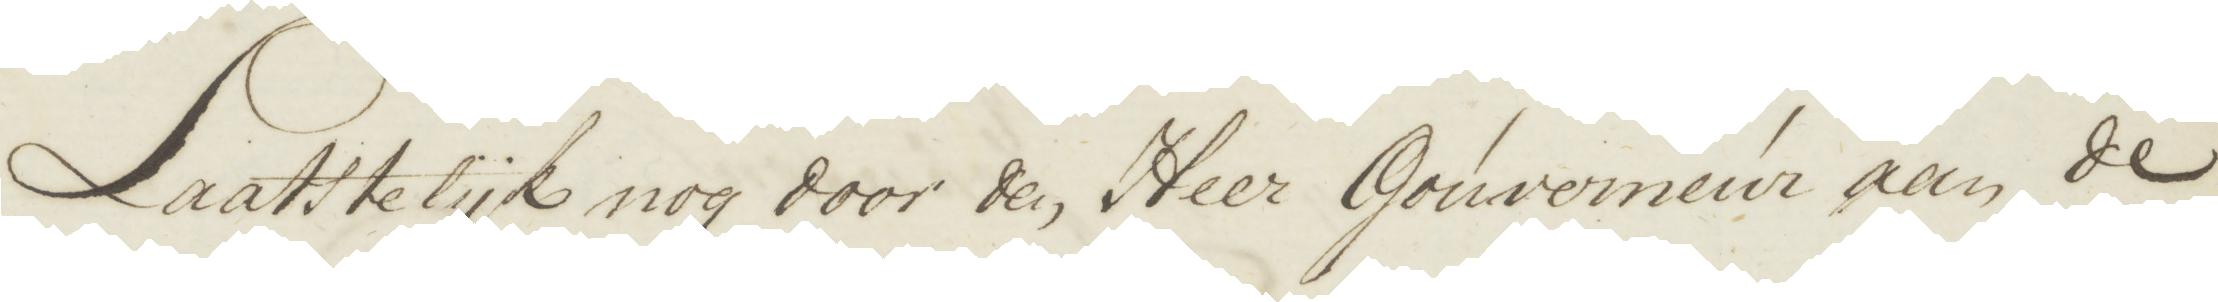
Laatstelijk nog door den Heer Gouverneur aan de
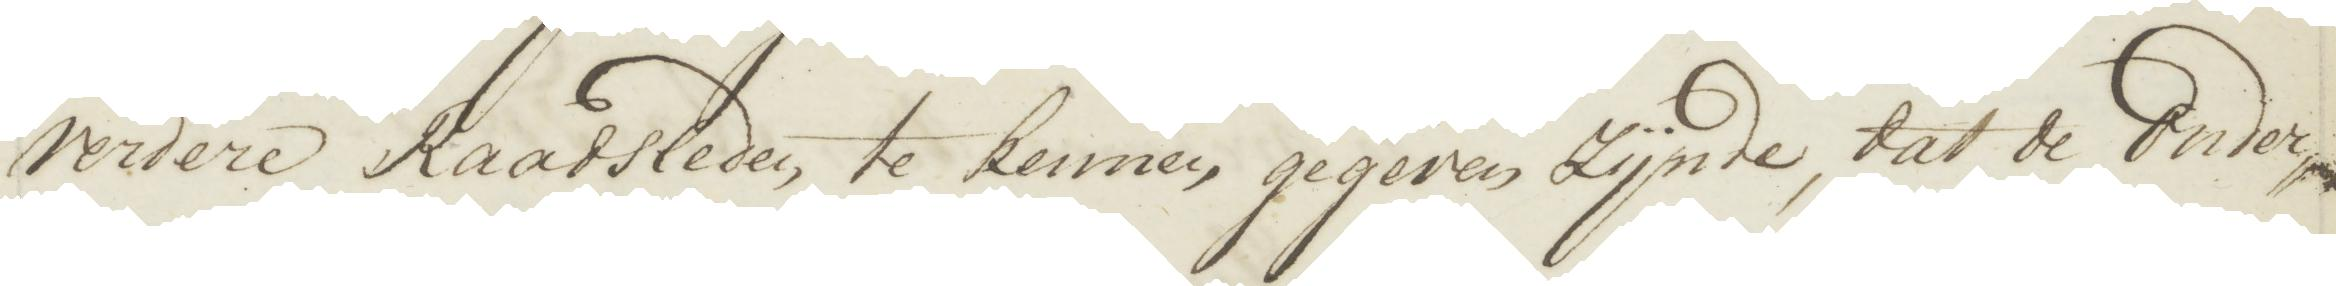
verdere Raadsleden te kennen gegeven zijnde, dat de onder„
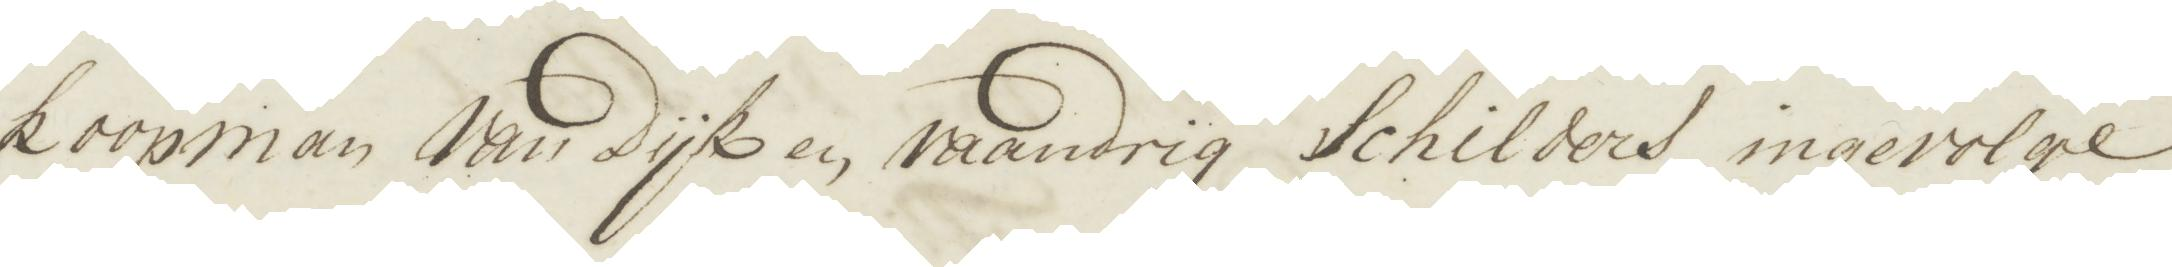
koopman van Dijk en vaandrig Schilders, ingevolge
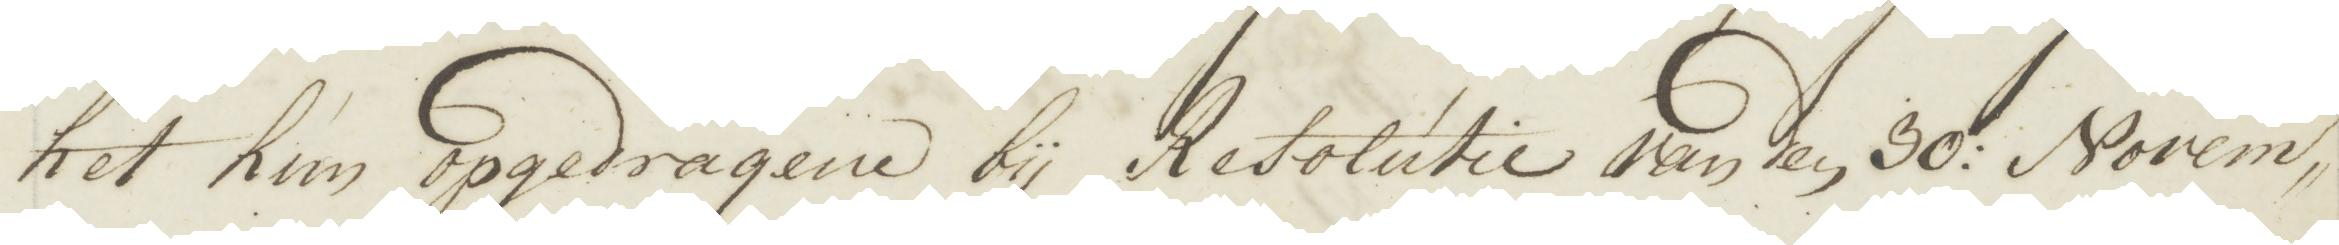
het hun opgedragene bij Resolutie van den 30: Novem„
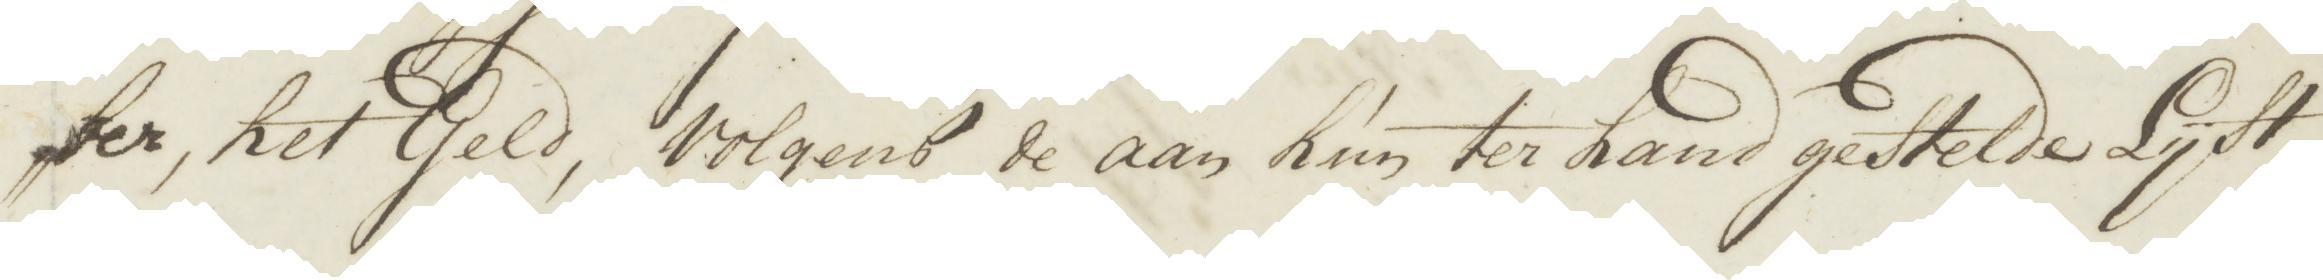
ber, het Geld, volgens de aan hun ter hand gestelde Lijst,
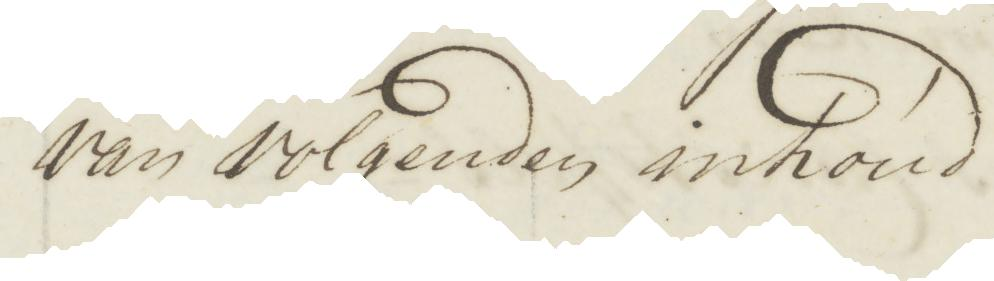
van volgenden inhoud.
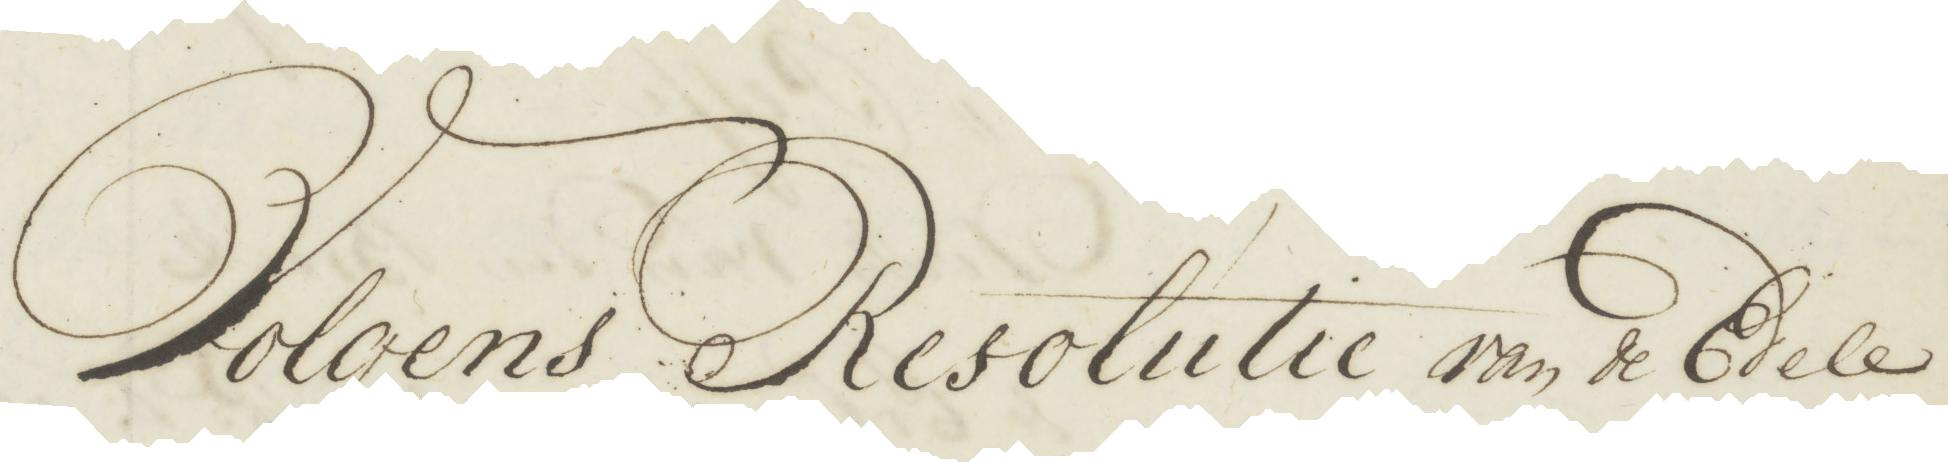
Volgens Resolutie van de Edele
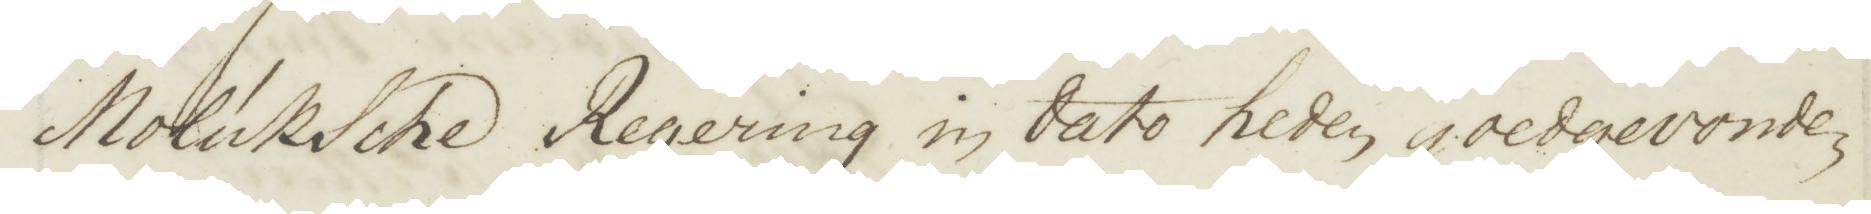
Moluksche Regering in dato heden goedgevonden
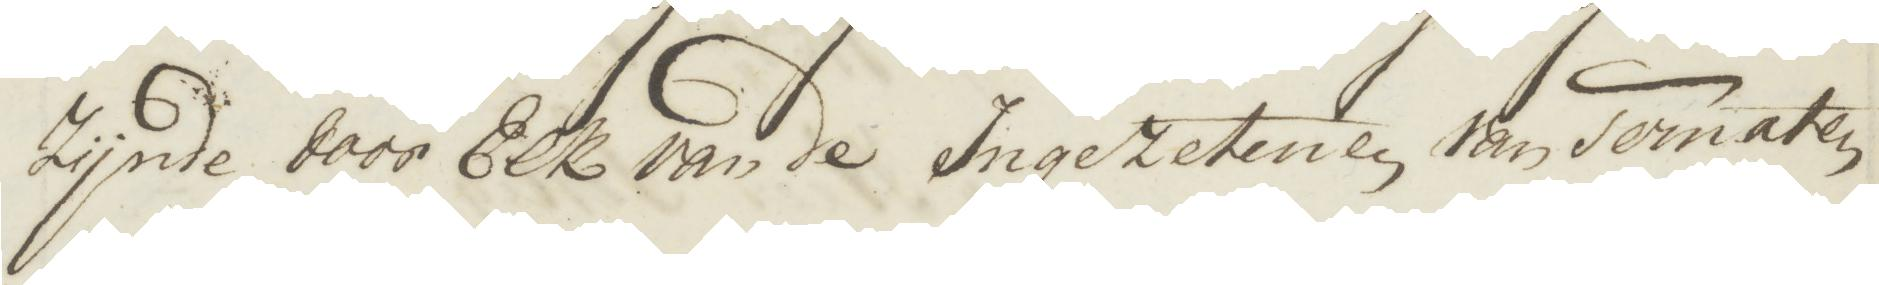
Zijnde door Elk van de Ingezetenen van Ternaten
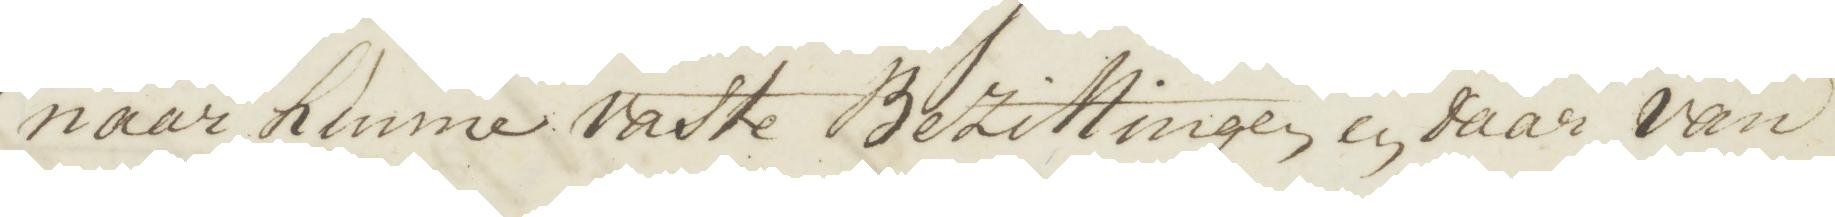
naar hunne vaste Bezittingen en daar van
